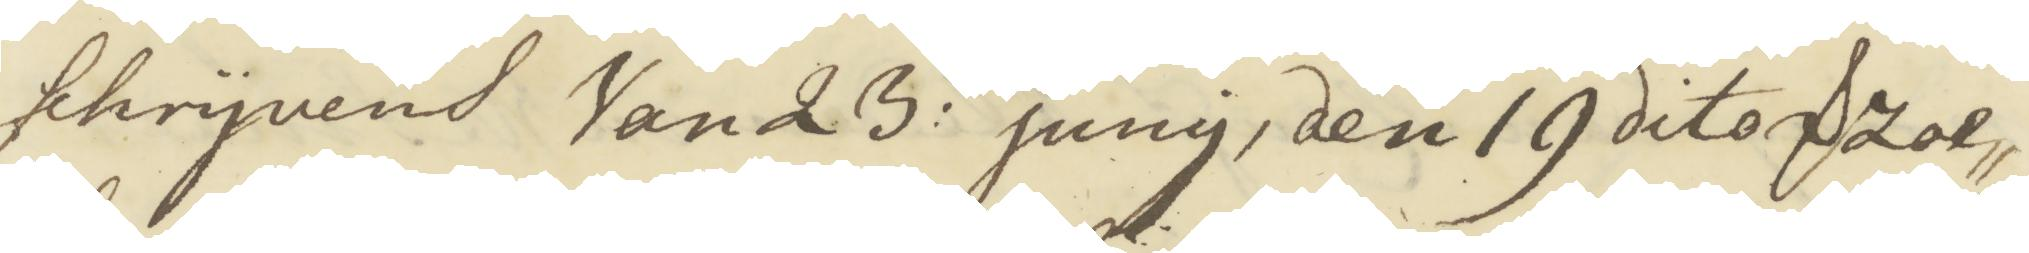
schrijvens van 23:' junij, den 19 dito verzoe„
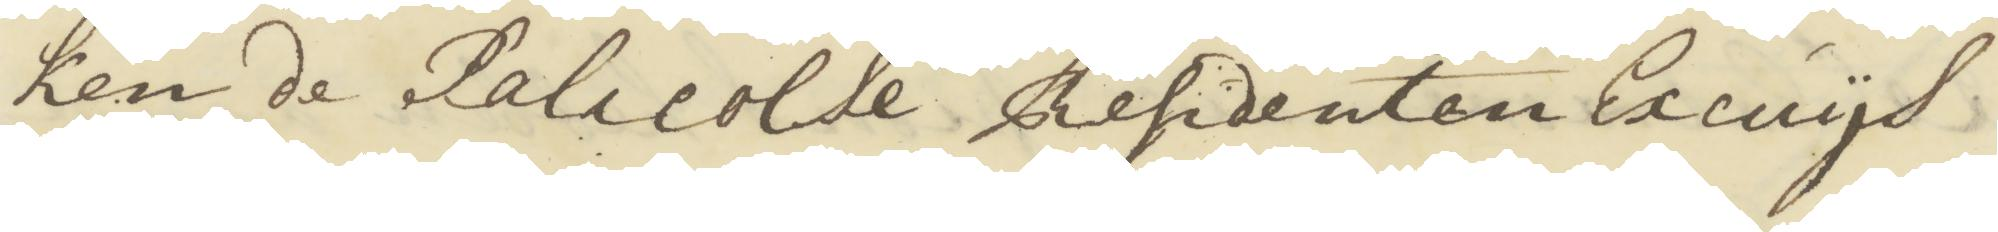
ken de Palicolse Residenten Excuijs
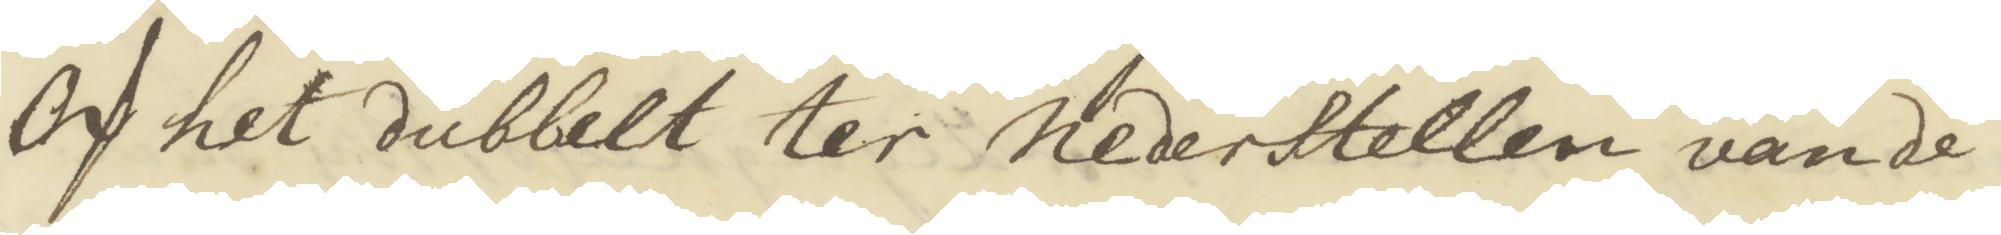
over het dubbelt ter nederstellen van de
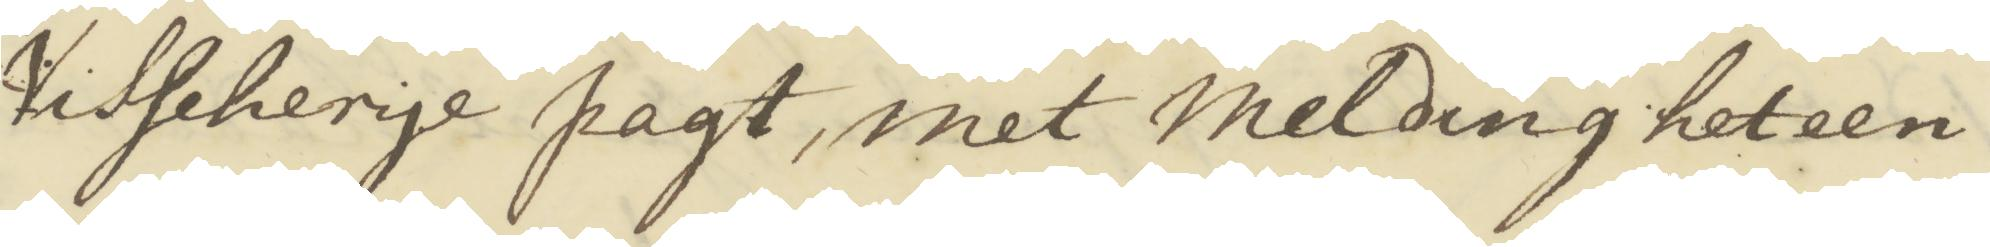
visscherije pagt, met melding het een
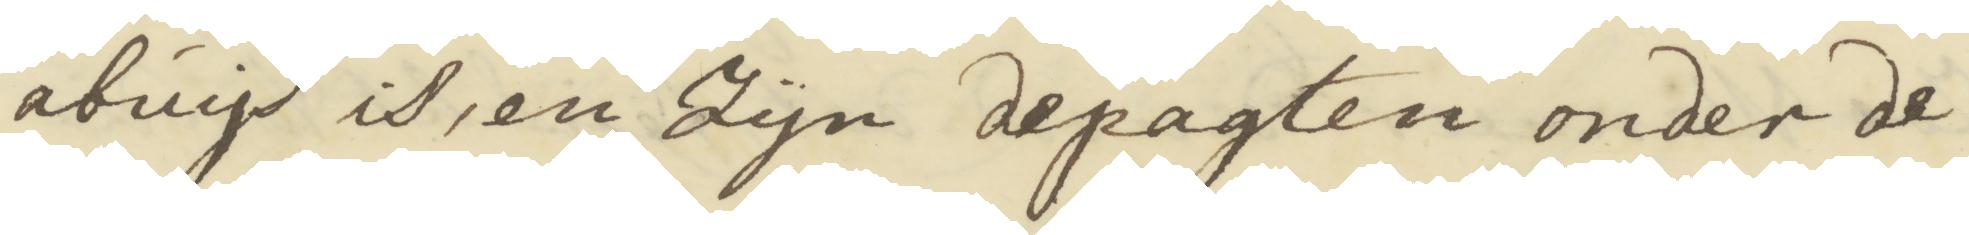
abuijs is, en zijn depagten onder de
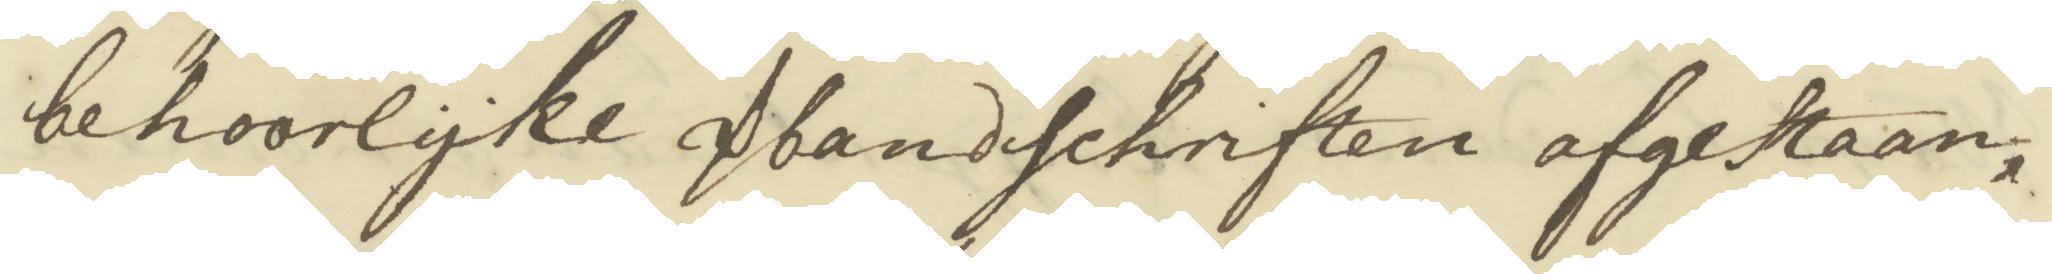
behoorlijke verbandschriften afgestaan,
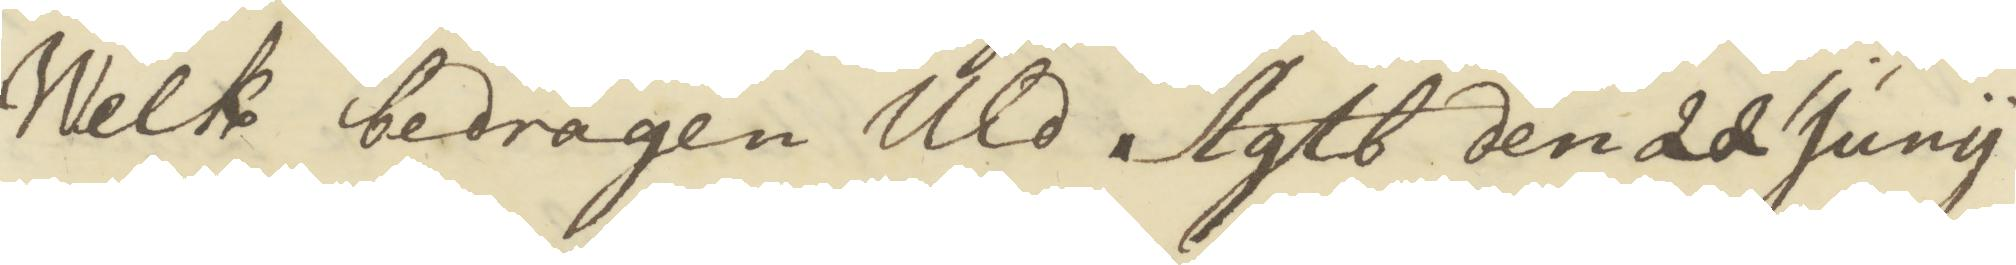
welk bedragen UEd Agtb den 22' Junij
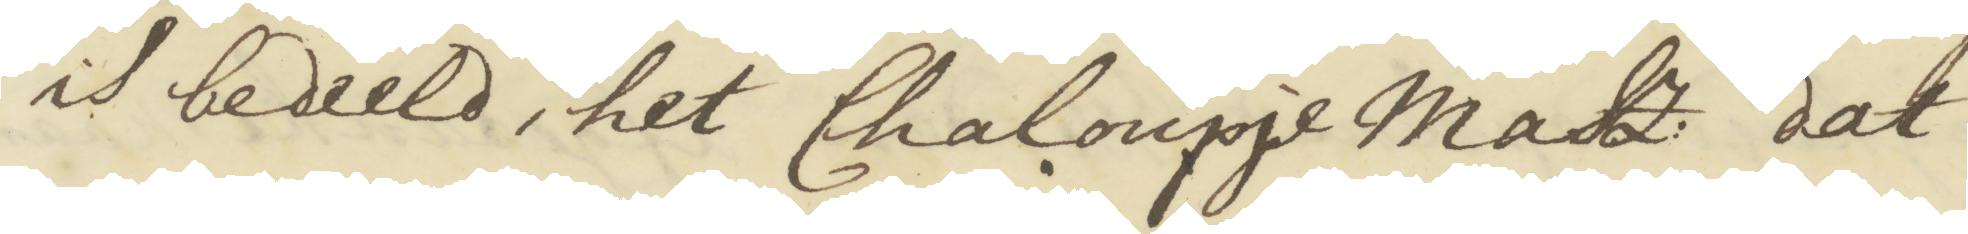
is bedeeld, het Chaloupje Masz: dat
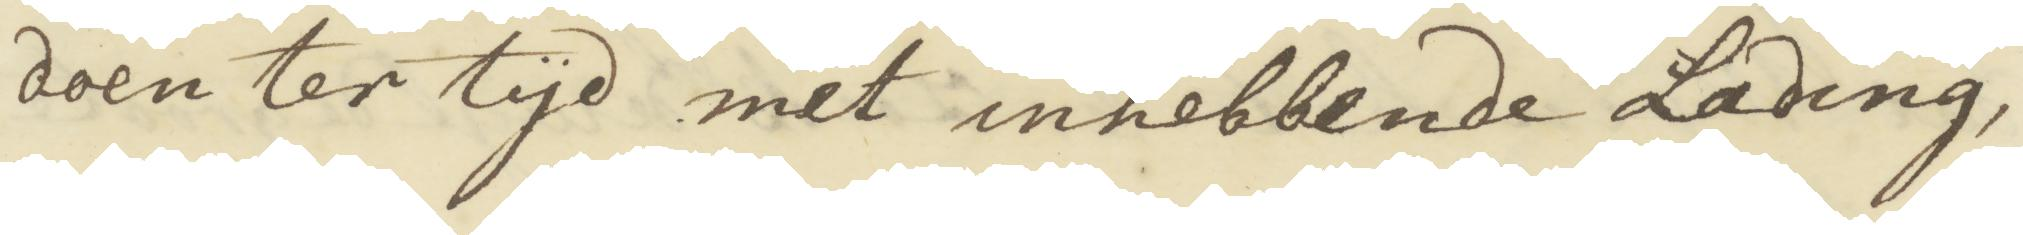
doen ter tijd met inhebbende Lading,
